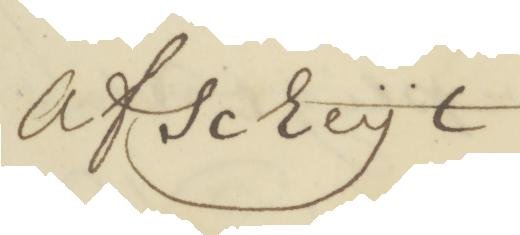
afscheijt
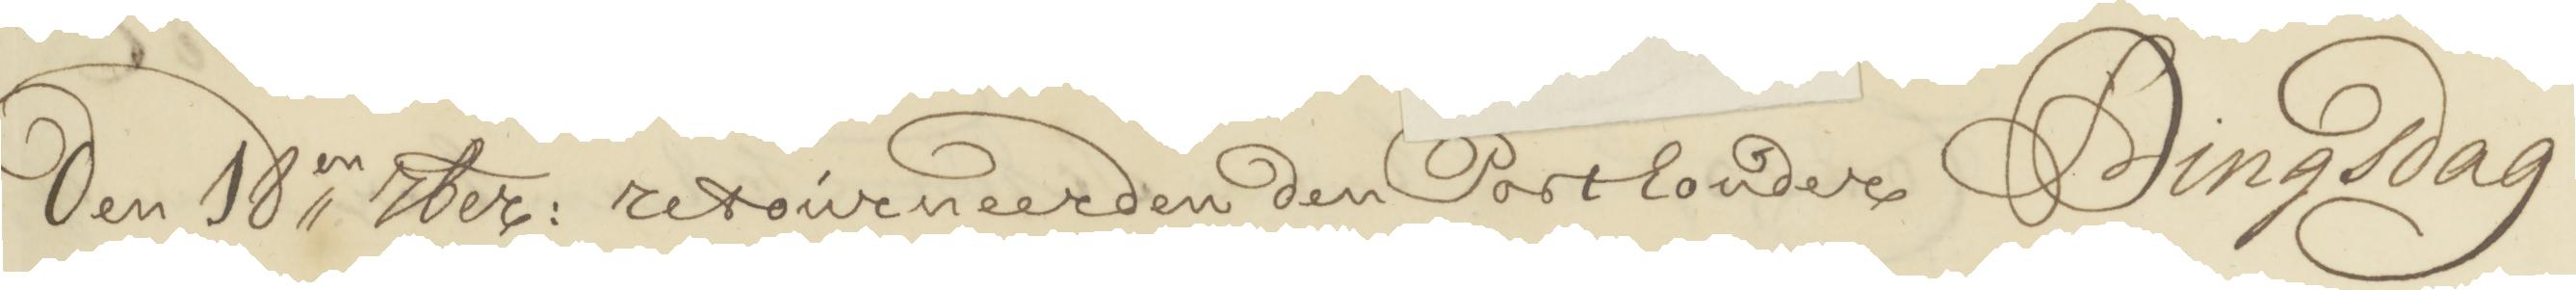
den 18„en 7ber: retourneerden den Posthouder Dingsdag
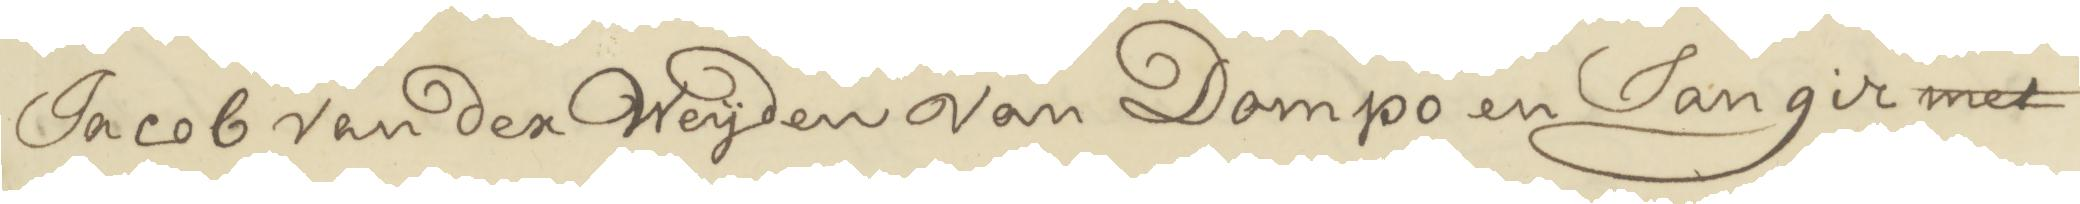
Iacob van der Weijden van Dompo en Sangir met
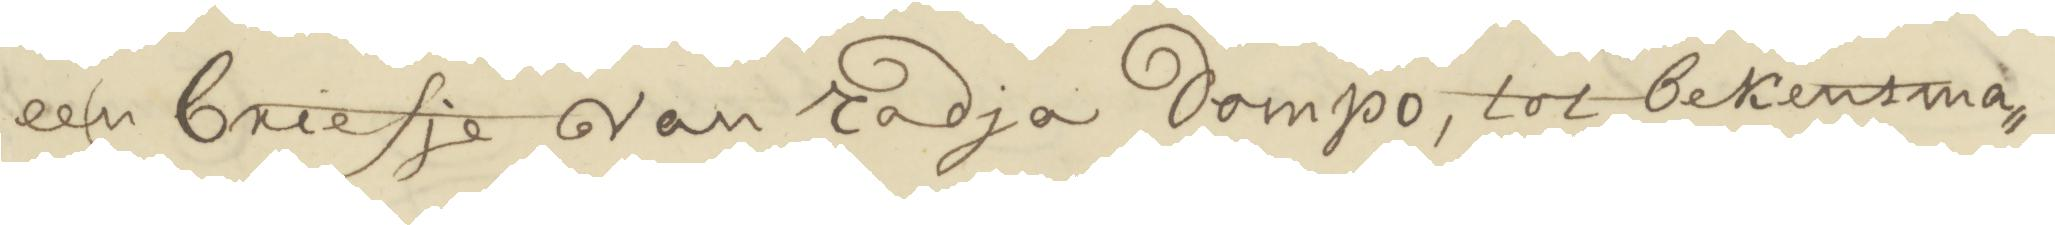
een briefje van radja dompo, tot bekentma„
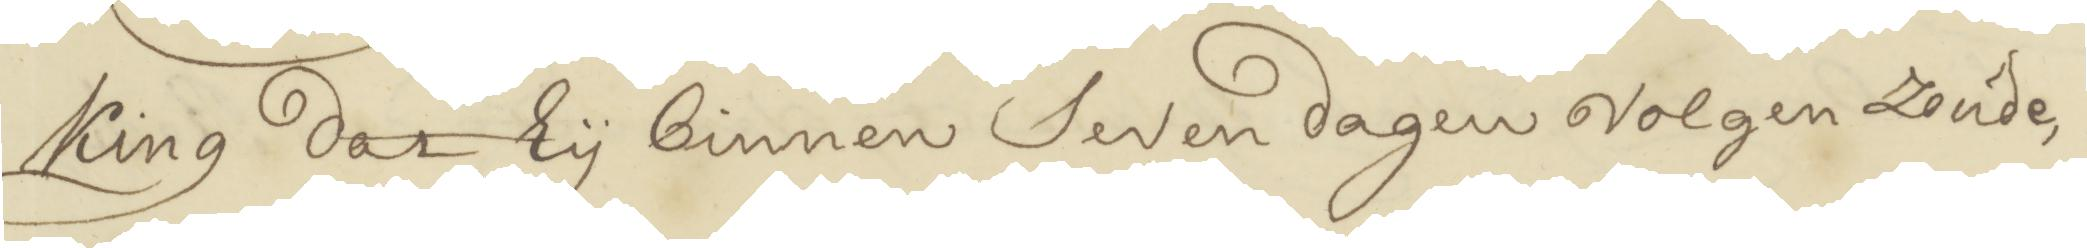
king dat hij binnen seven dagen volgen zoude,
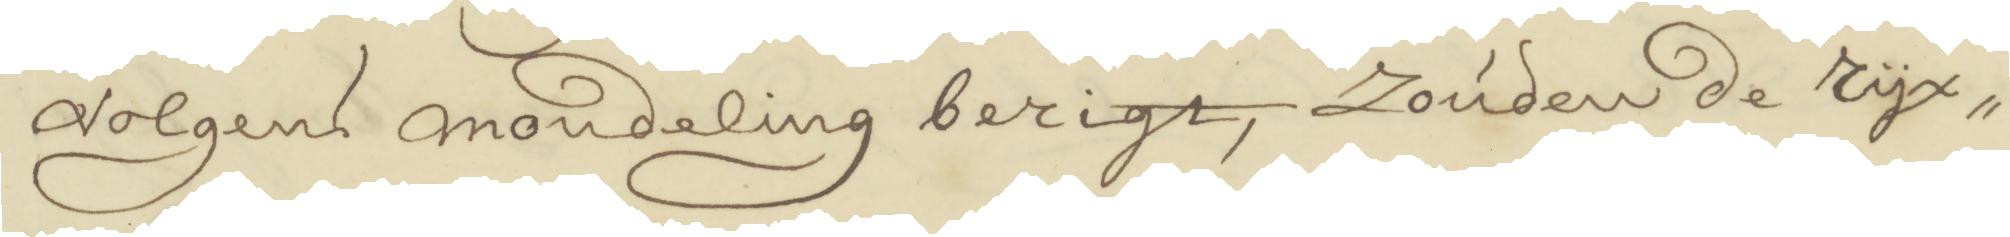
volgens mondeling berigt, zouden de rijx„
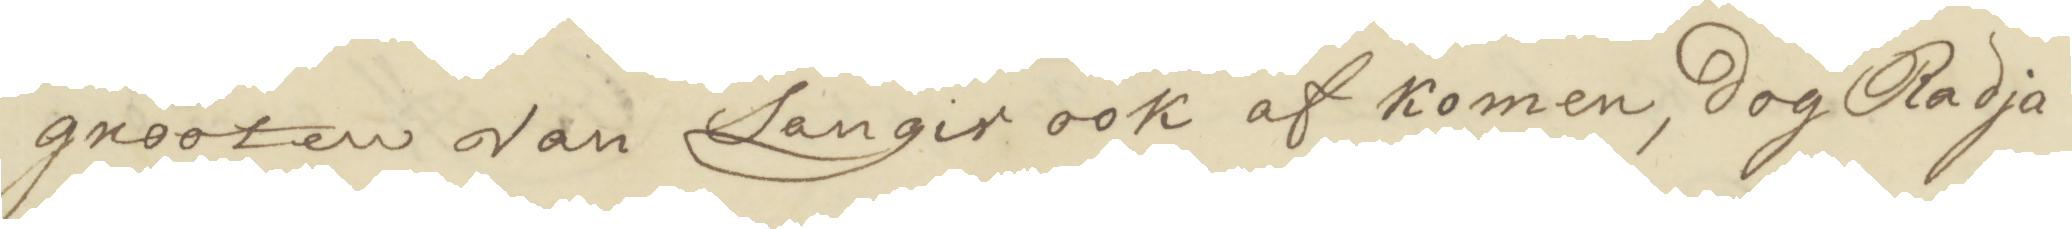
grooten van sangir ook af komen, dog Radja
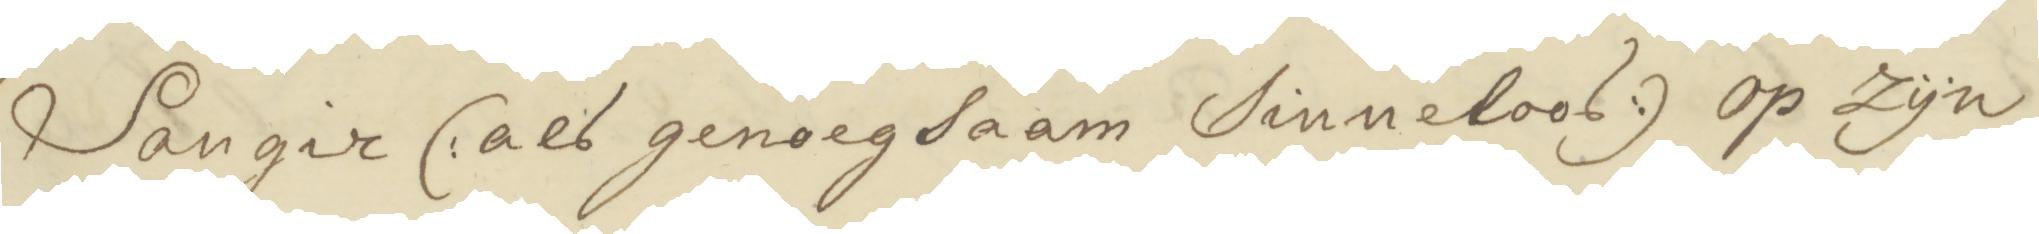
Sangir (:als genoegsaam Sinneloos:) op zijn
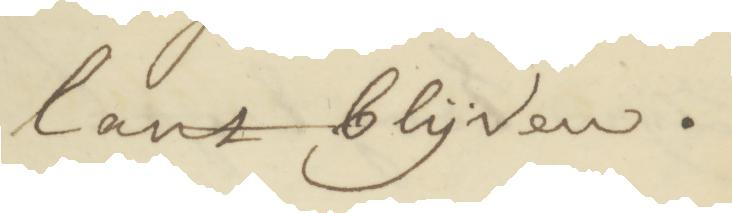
lant blijven.
